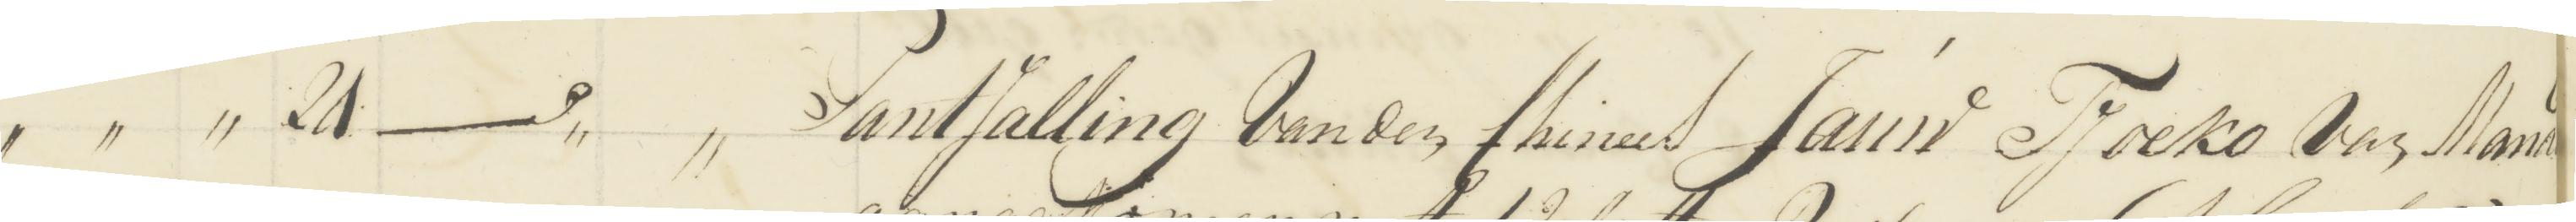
„ „ „ 24: —„o „ Pantjalling van den Chinees Jaun Tjoeko van Mana
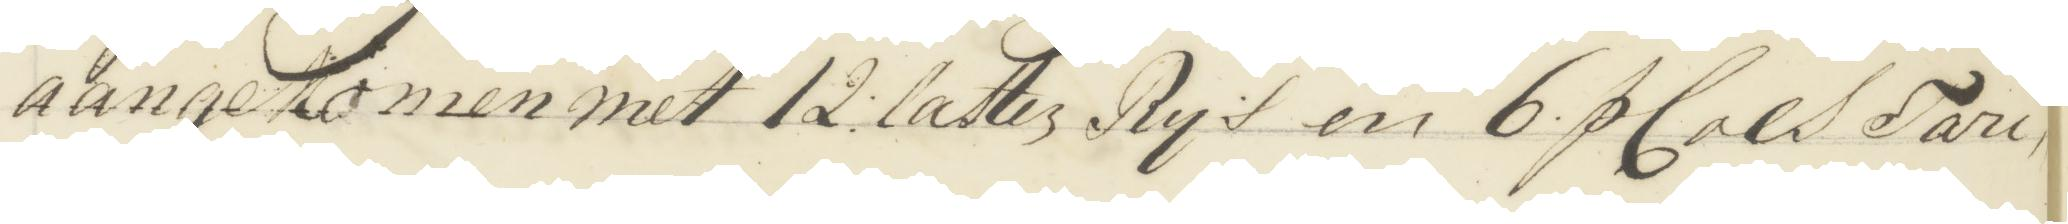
aangekomen met 12: lasten Rijs en 6: pCols Tari„
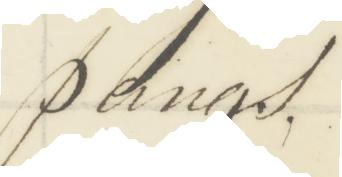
pangs
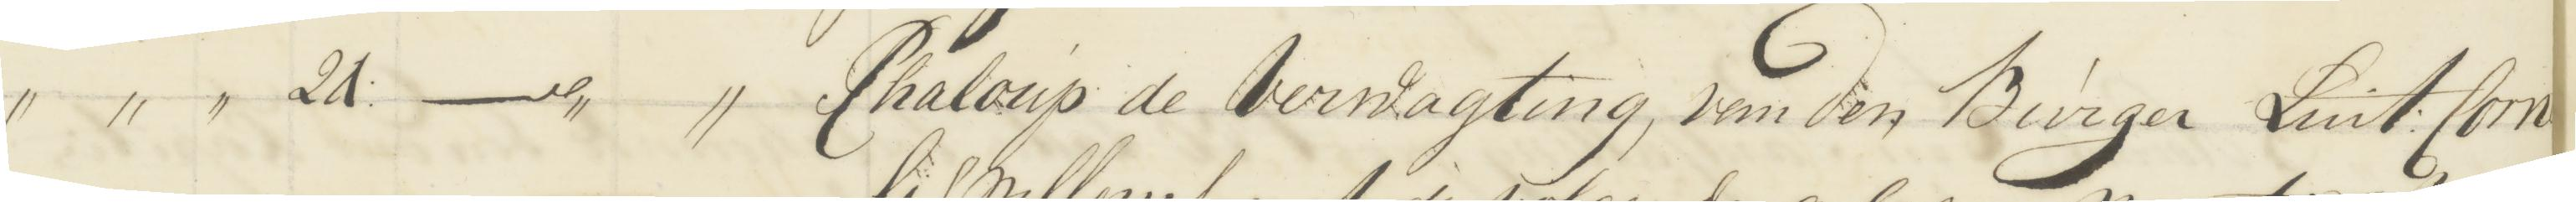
„ „ „ 24: —„o „ Chaloup de verwagting, van den Burger Luit: Corn
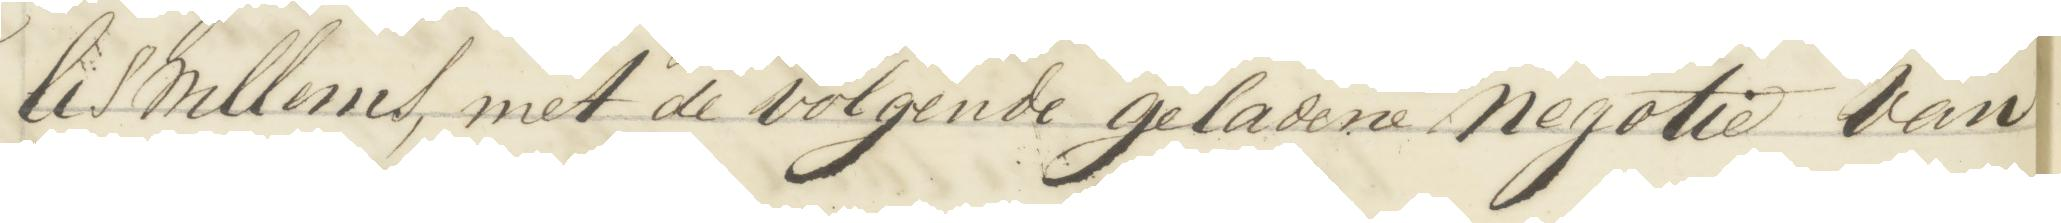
lis Nillems, met de volgende geladene negotie van
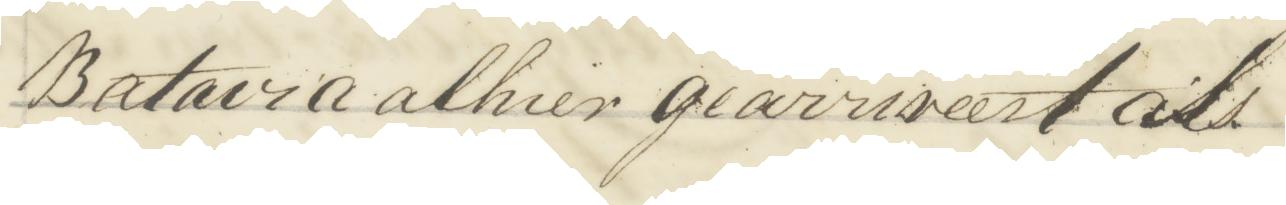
Batavia alhier gearriveert als
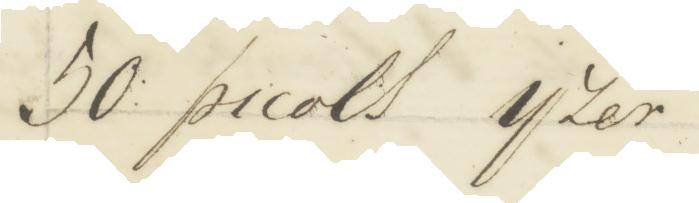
50: picols yzer
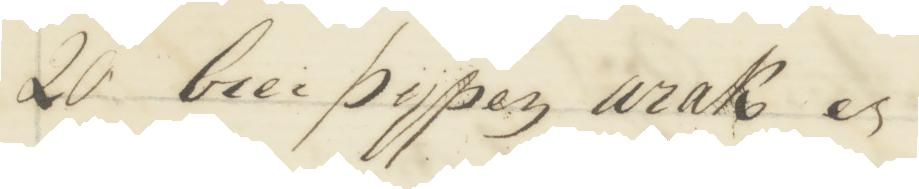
20 bier pijpen arak en
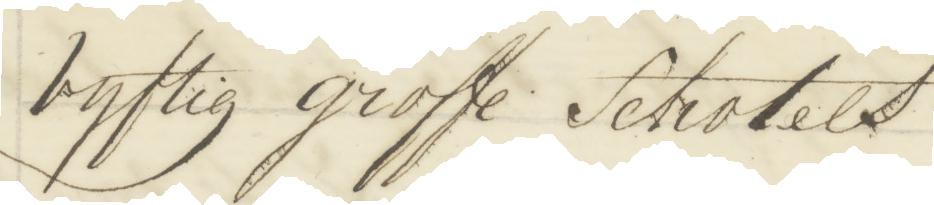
vyftig groffe schotels
